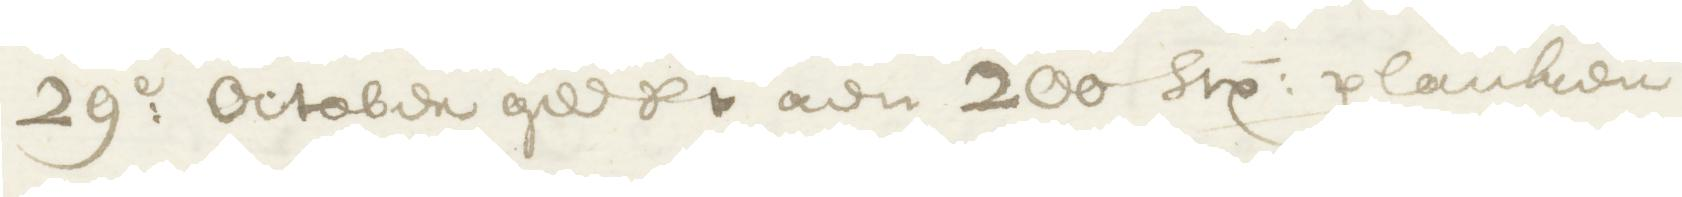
29:e October geeft aen 200 stx: planken
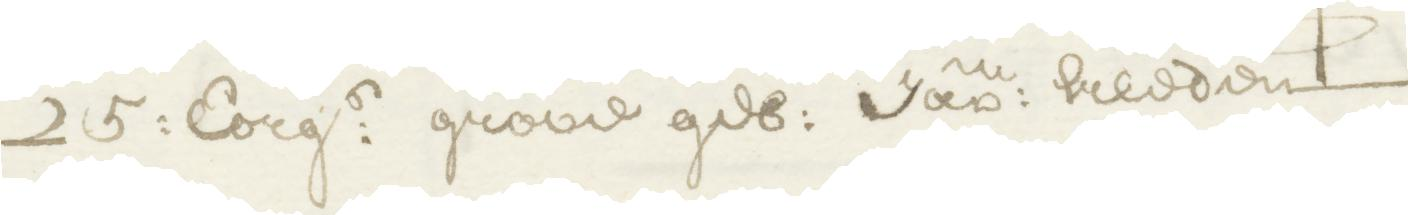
25: Corg:s grove geb: Iav: kleden
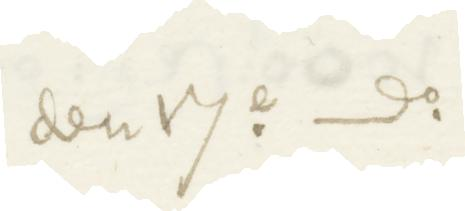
den 17.e d.o
